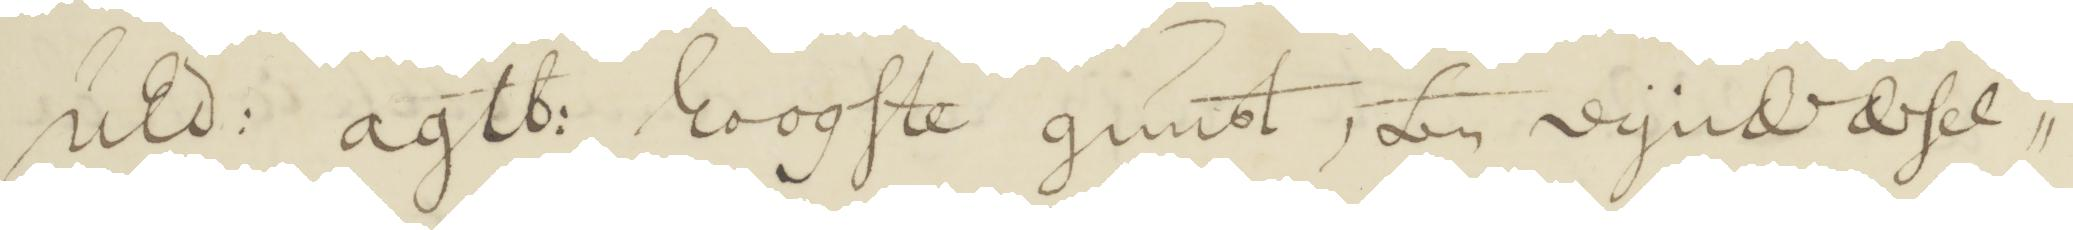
uEd: agtb: hoogste gunst, ten eijnde desel„
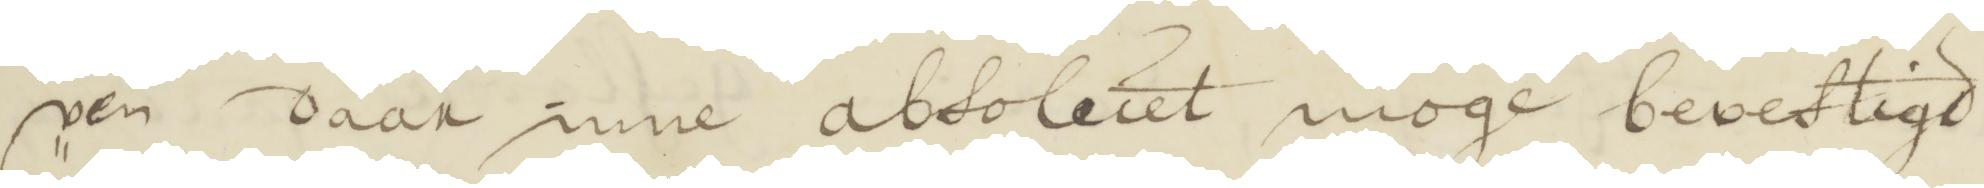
„ven daar inne absoluet moge bevestigd
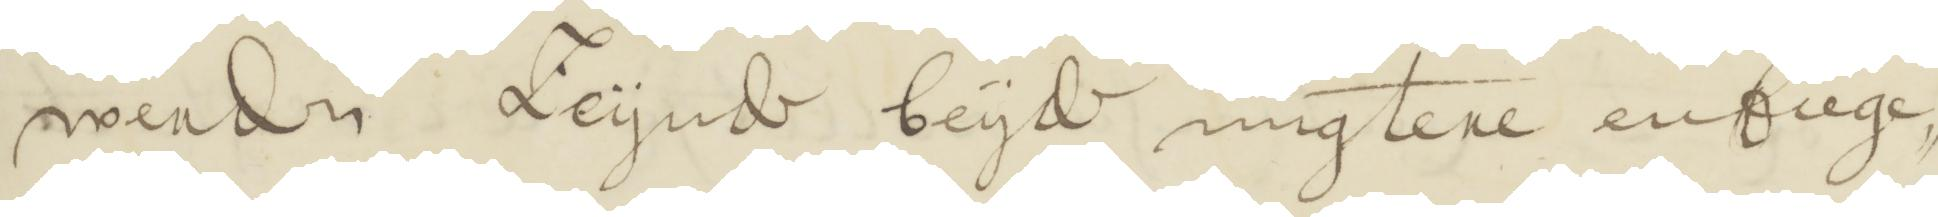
werden zeijnde beijde nugtere en fiege„
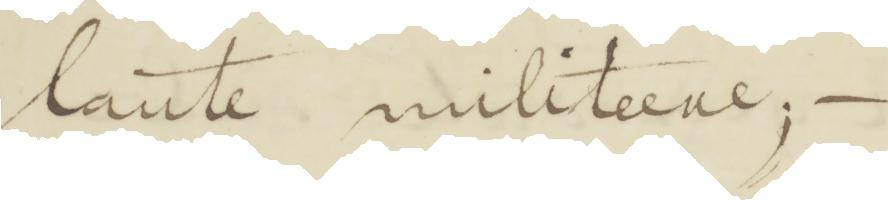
lante militeere; —
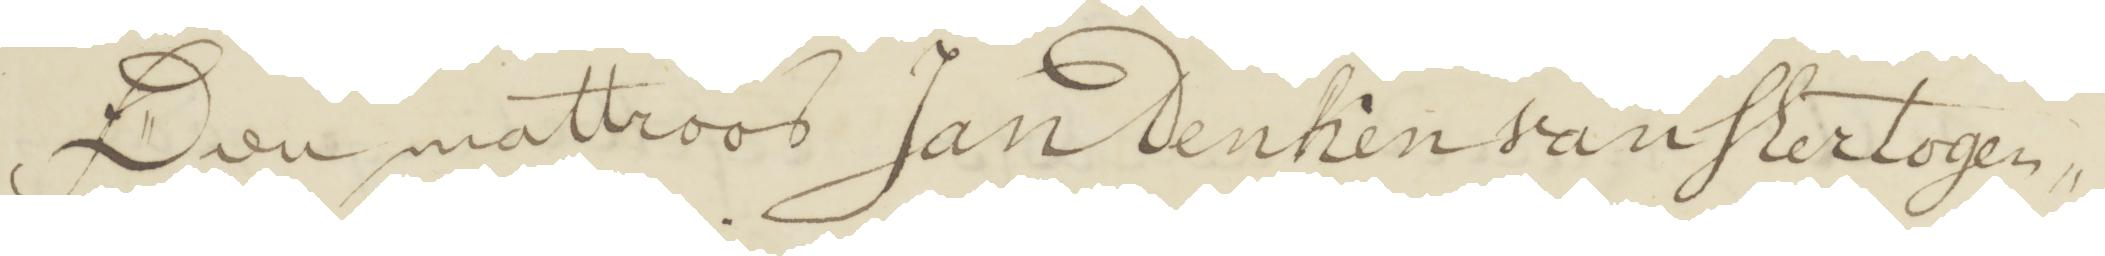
Den mattroos Jan denken van shertogen„
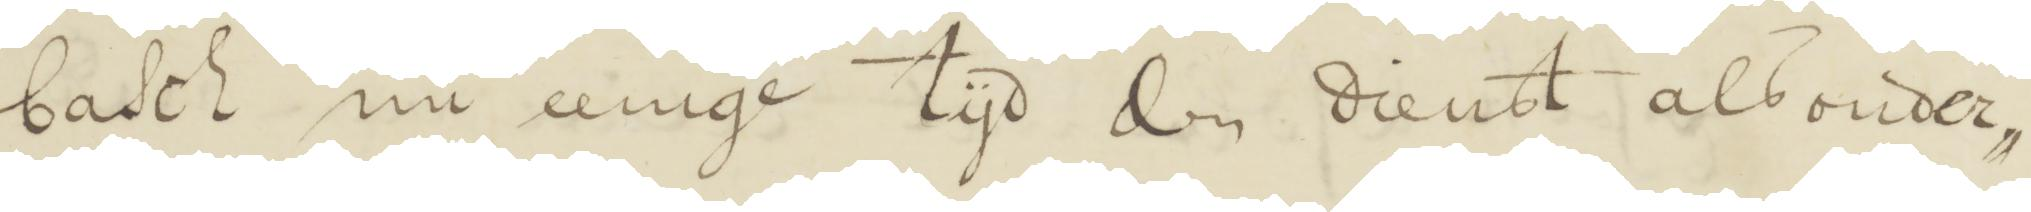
bosch nu eenige tijd den dienst als onder„
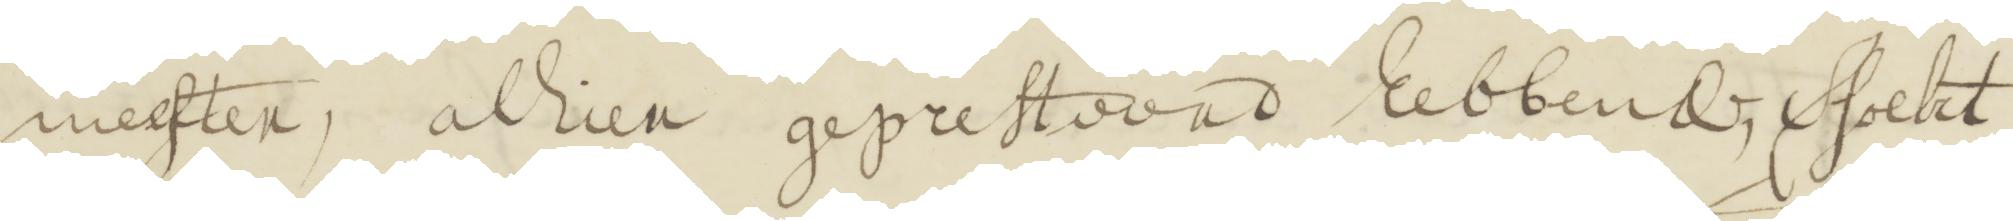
meester, alhier gepresteerd hebbende, versoekt
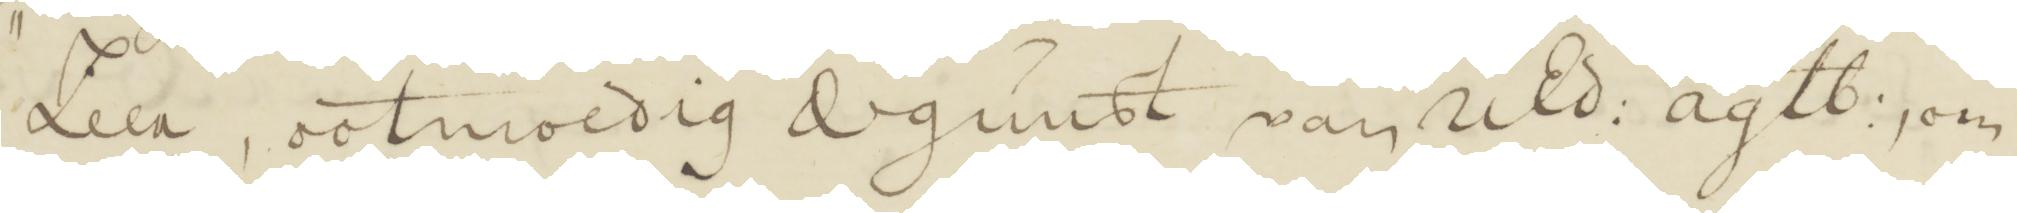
zeer, ootmoedig degunst van uEd: agtb:, om
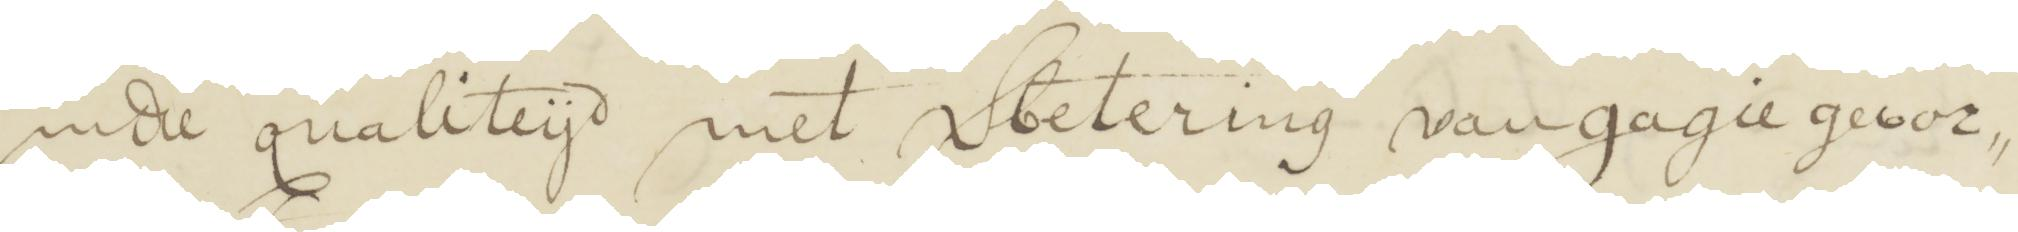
in die qualiteijd met verbetering van gagie gevor„
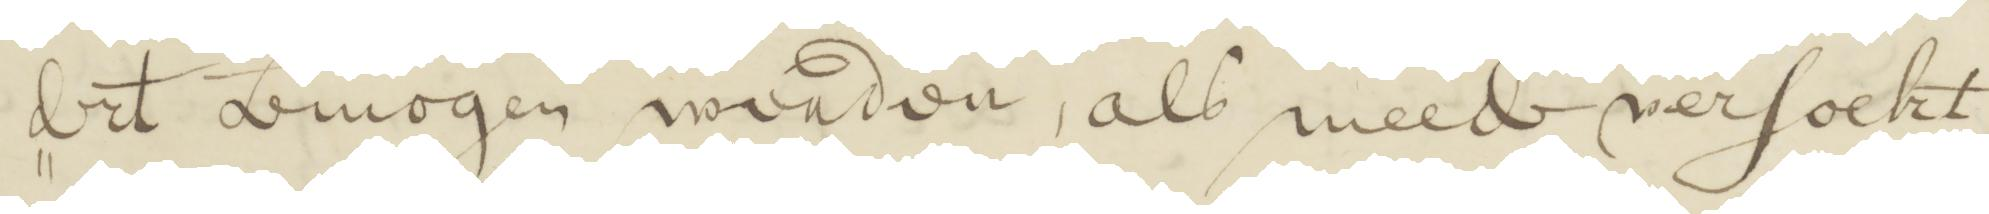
„dert temogen werden, als meede versoekt
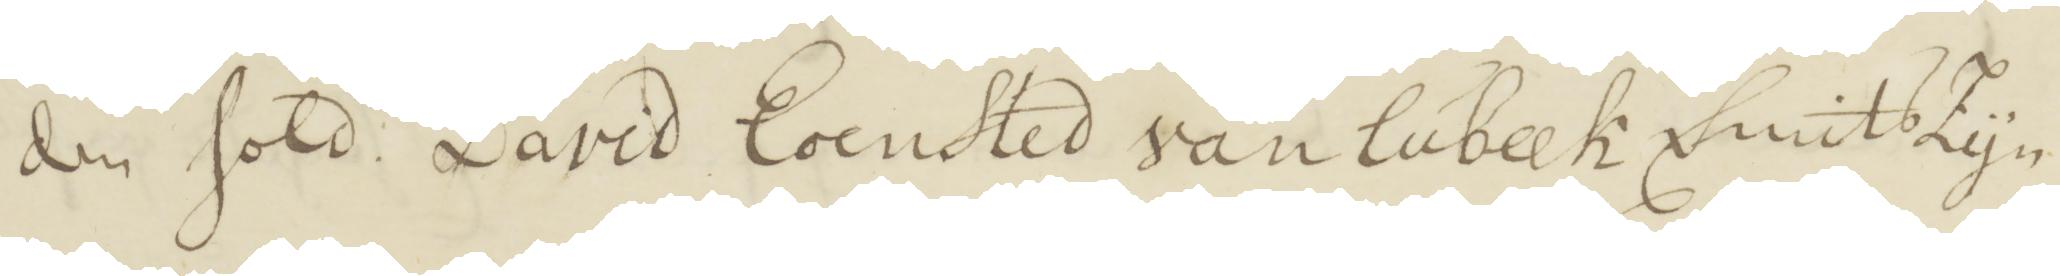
den sold:t David hoensted van lubeek vermits zijn
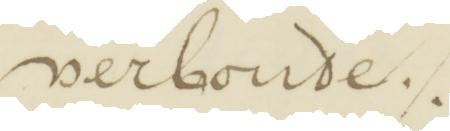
verbonde./.
